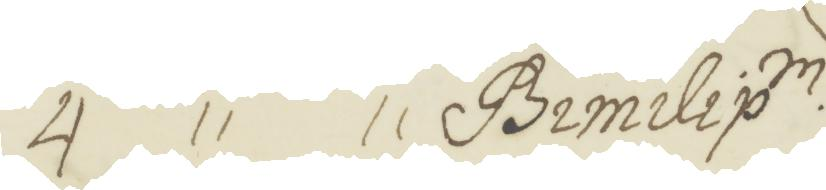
4 „ „ Bimilip:m
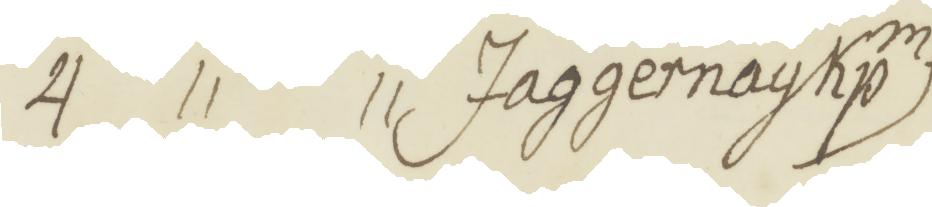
4 „ „ Jaggernaijkp:m
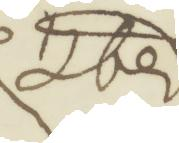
zber
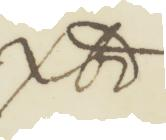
Xbr
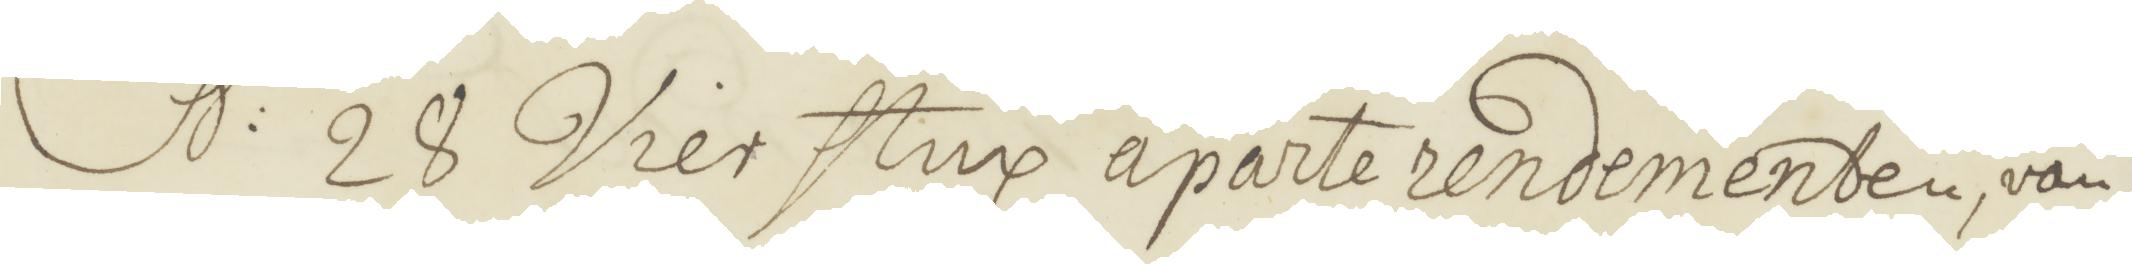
N: 28 Vier stux aparte rendementen, van
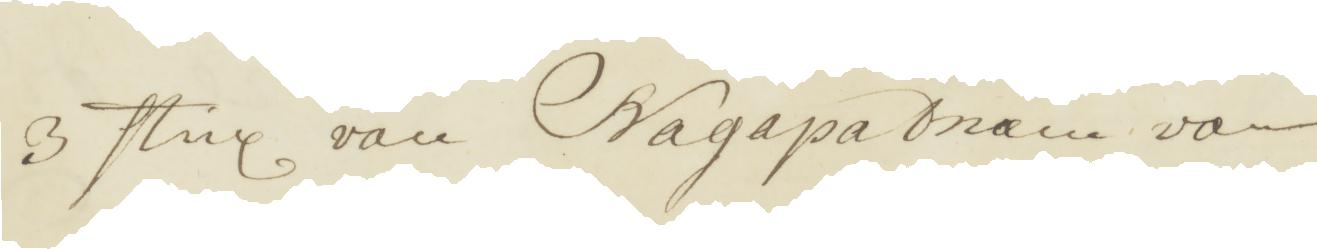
3 stux van Nagapatnam van
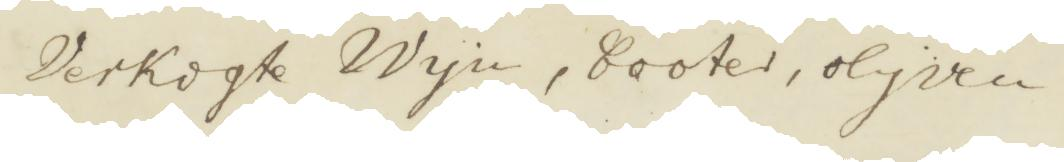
Verkogte Wijn, booter, olijven
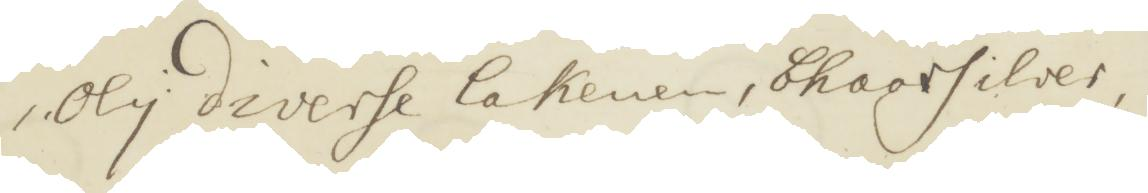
„olij diverse lakenen, bhaarsilver,
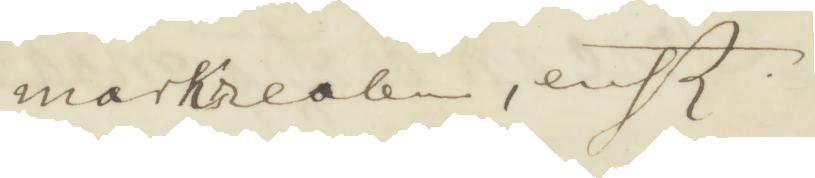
markrealen, ensz.
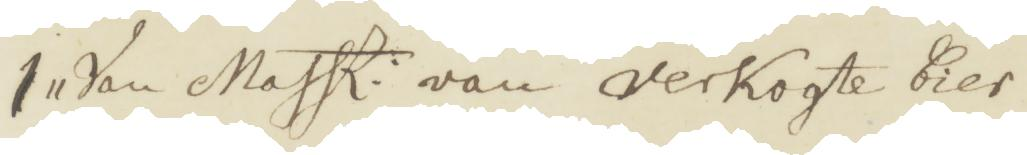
1 „ Van Massz: van verkogte bier
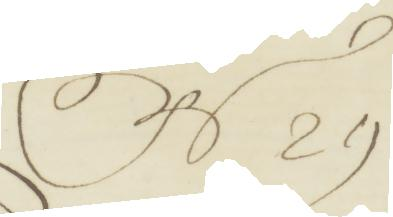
N 29
